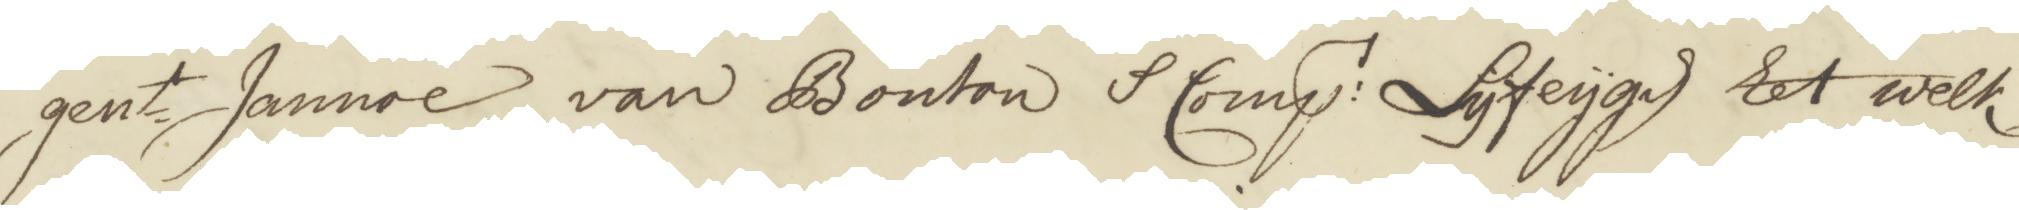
gen=t Jannoe van Bouton ’s Comp:s lijfeijgen het welk
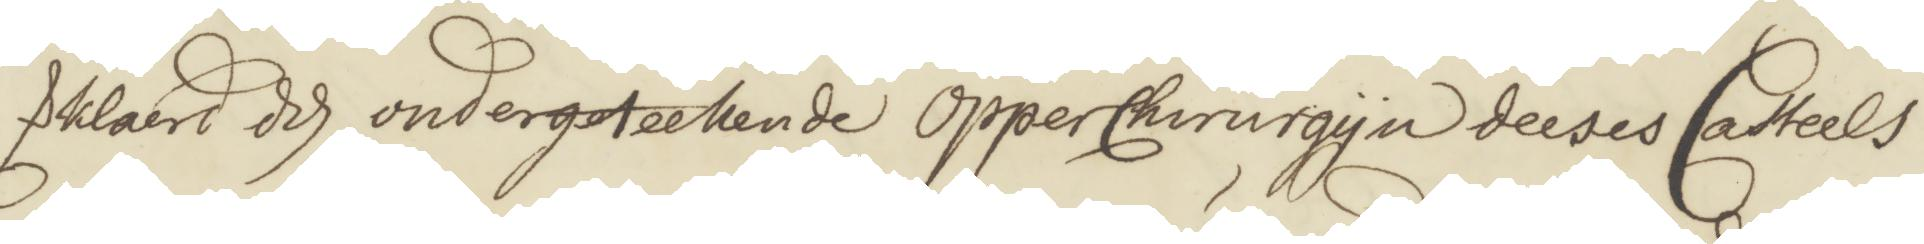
verklaerd den ondergeteekende opperchirurgijn deeses Casteels
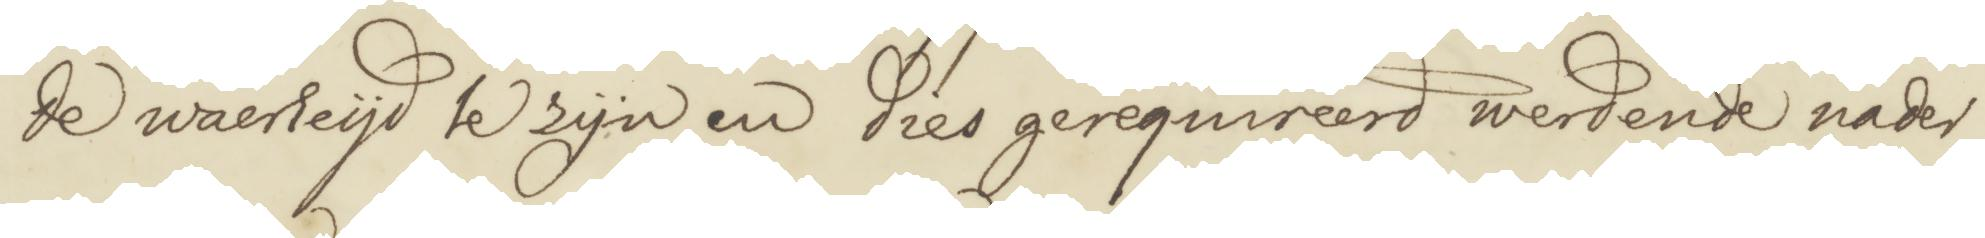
de waerheijd te zijn en dies gerequireerd werdende nader
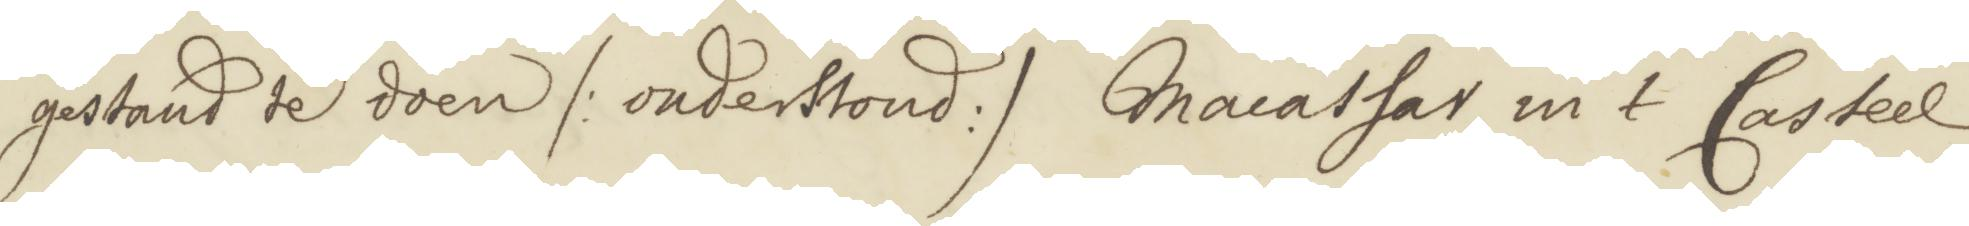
gestand te doen (:onderstond:) Macassar in ’t Casteel
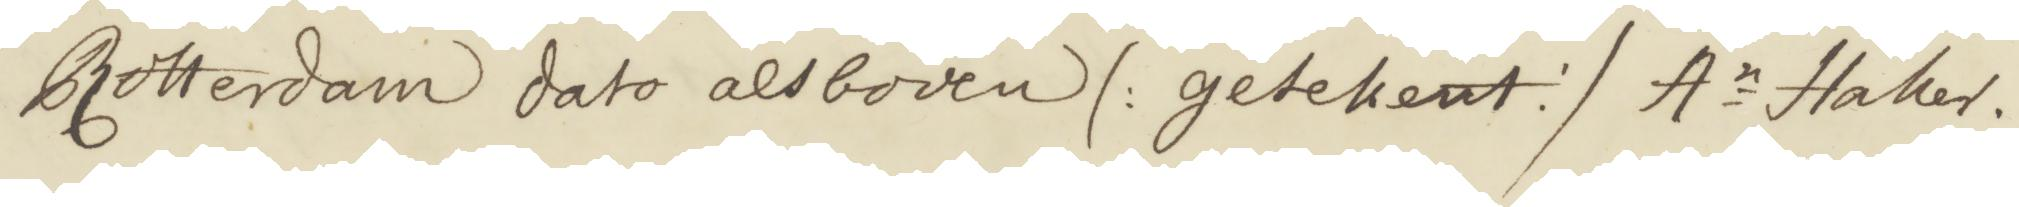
Rotterdam dato als boven (:getekent:) A=r Haker.
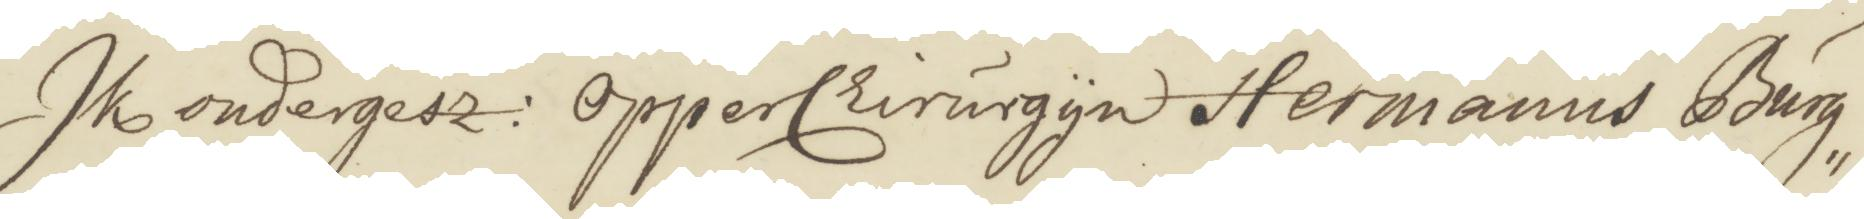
Jk ondergesz: opperchirurgijn Hermanus Burg„
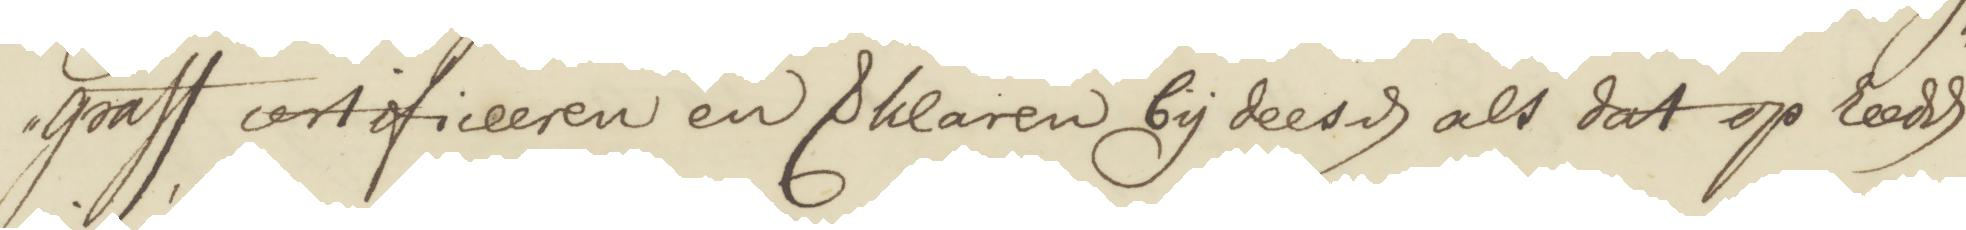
„graff certificeeren en verklaren bij deesen als dat op heeden
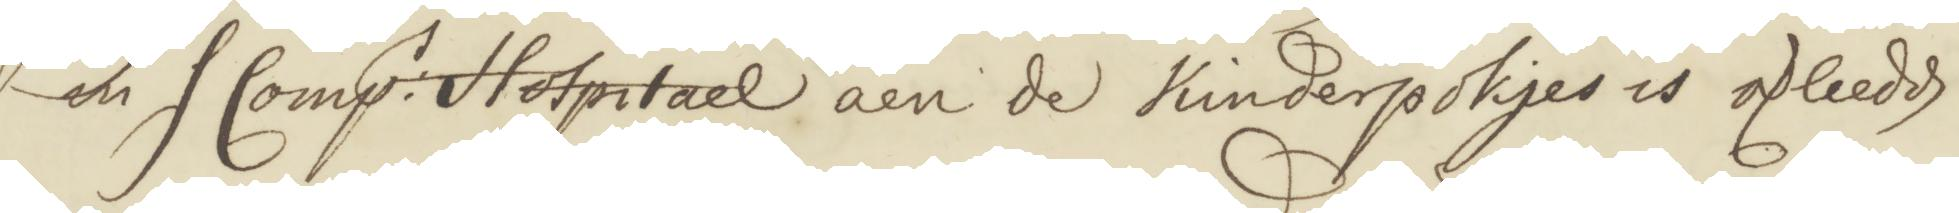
in ’s Comp:s Hospitael aen de kinderpokjes is overleeden
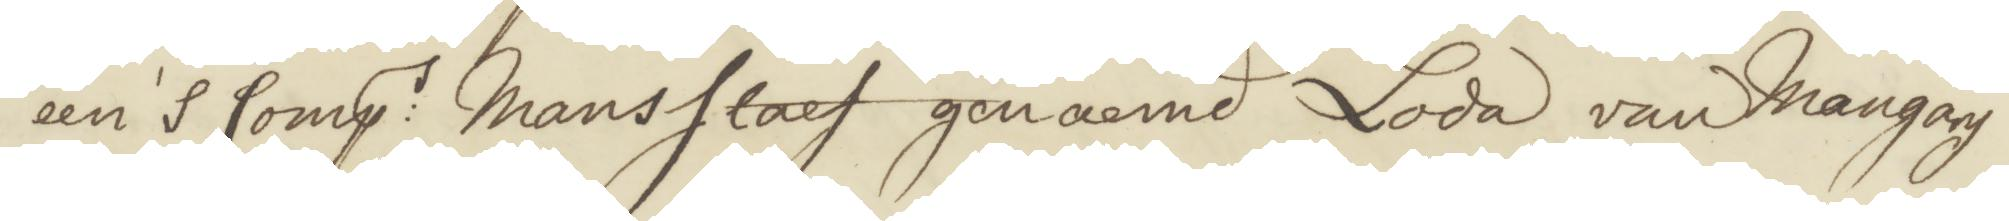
een ’s Comp:s mansslaef genaemd Loda van mangorij
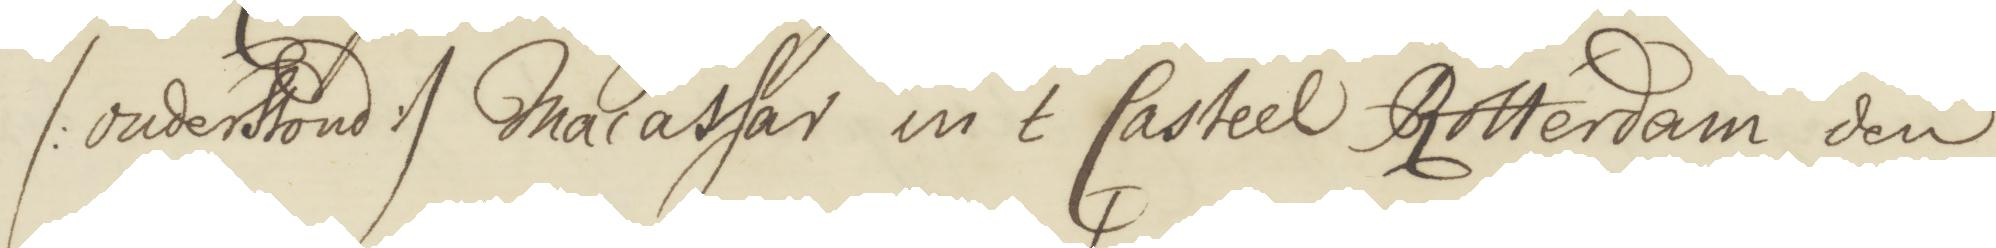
(:onderstond:) Macassar in ’t Casteel Rotterdam den
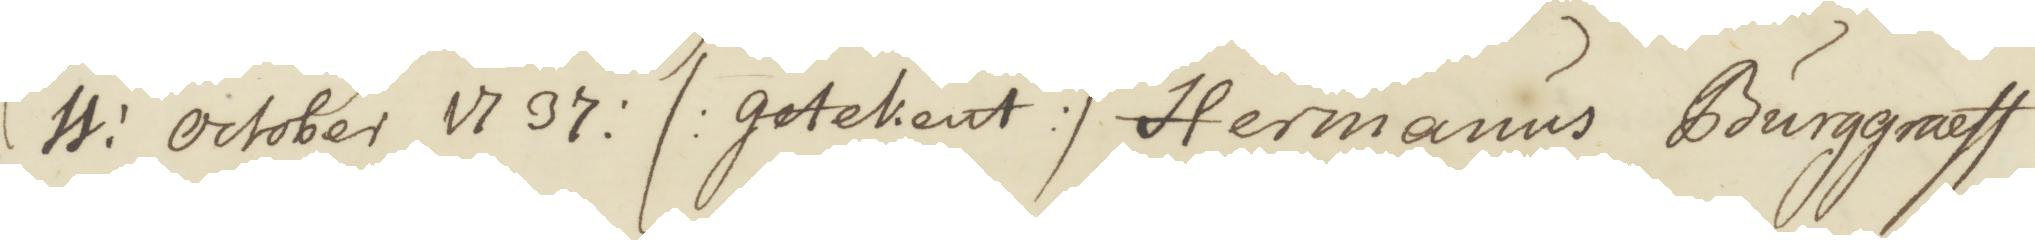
11:' october 1737: (:getekent:) Hermanus Burggraeff
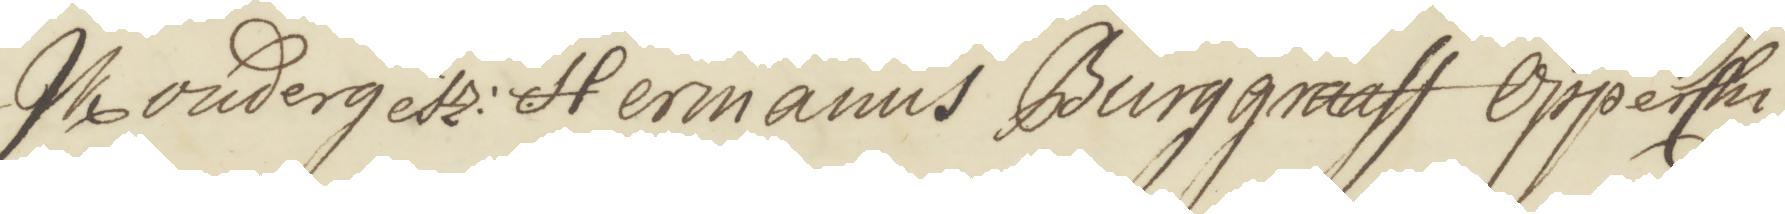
Ik ondergesz: Hermanus Burggraaff Opperchi
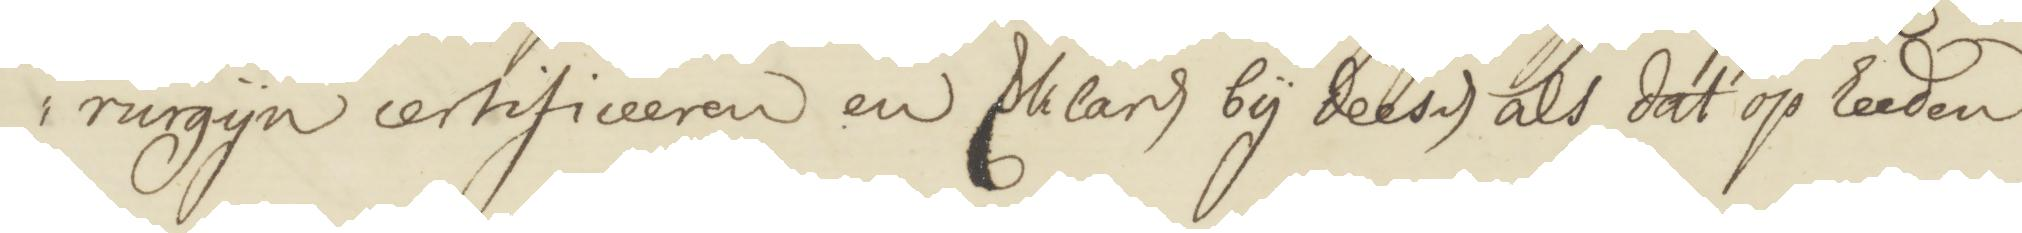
„rurgijn certificeeren en verklaren bij deesen als dat op heeden
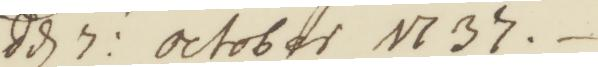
den 7:' october 1737. —
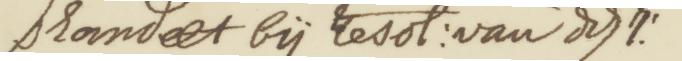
verhandelt bij resol: van den 7:'
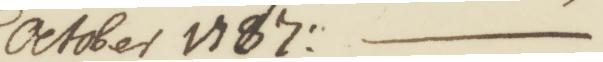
October 1787: —
